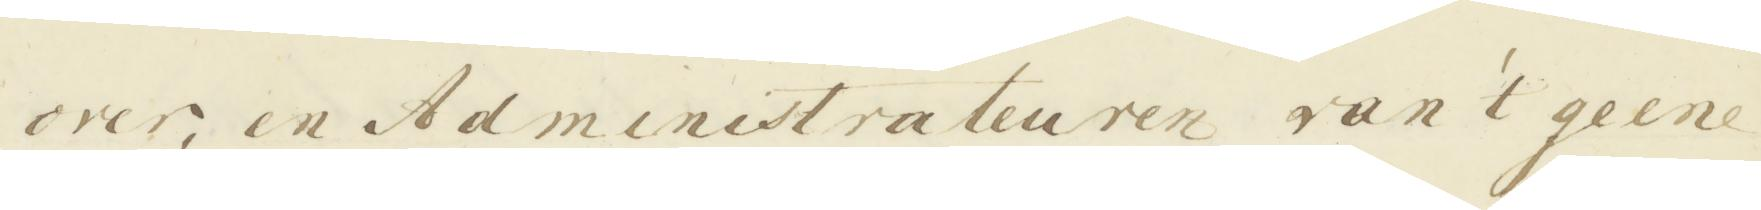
over, en Administrateuren van ’t geene
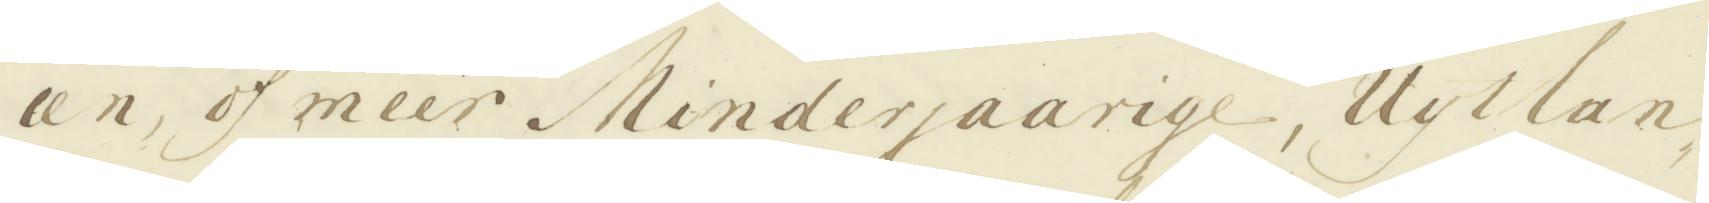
een, of meer Minderjaarige, Uytlan,
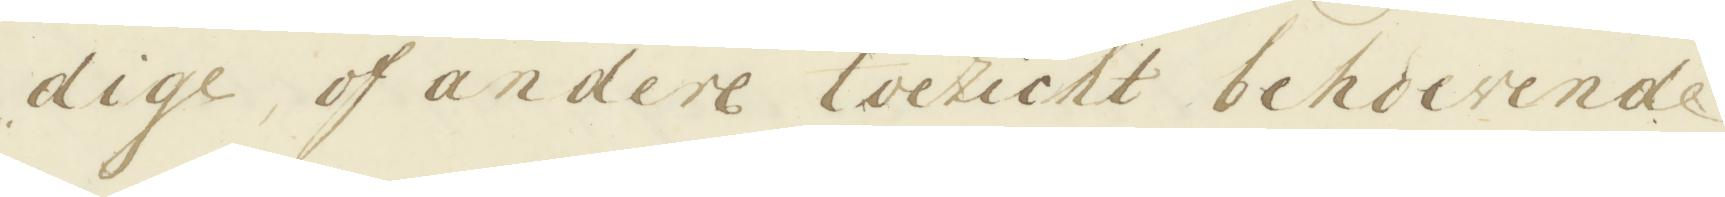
„dige, of andere toezicht behoevende
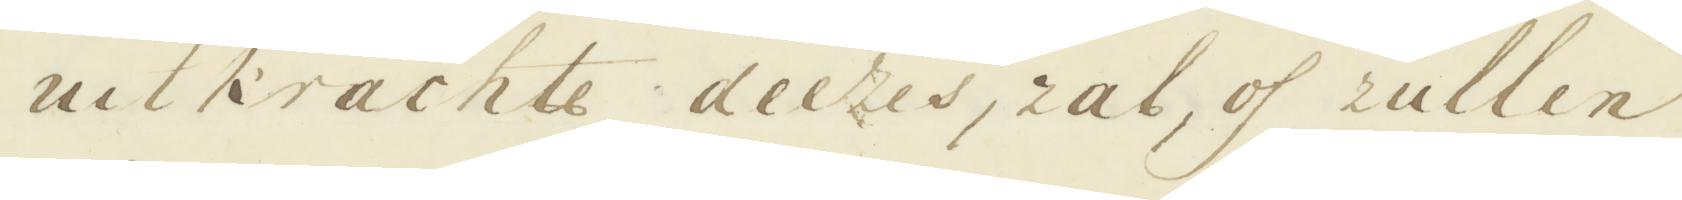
uit krachte deezes, zal, of zullen
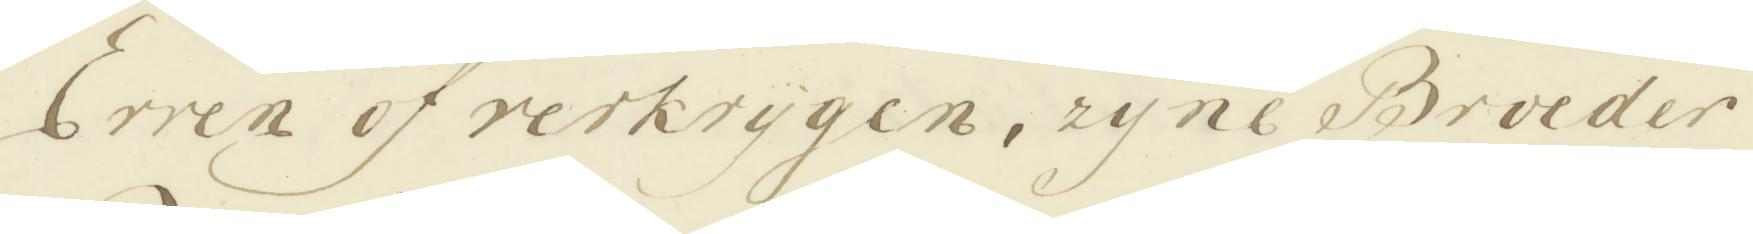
Erven of verkrijgen, zijne Broeder
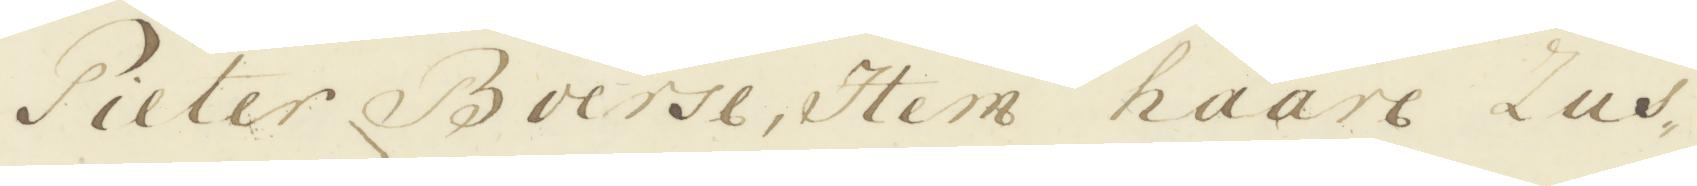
Pieter Boerse, Item haare Zus„
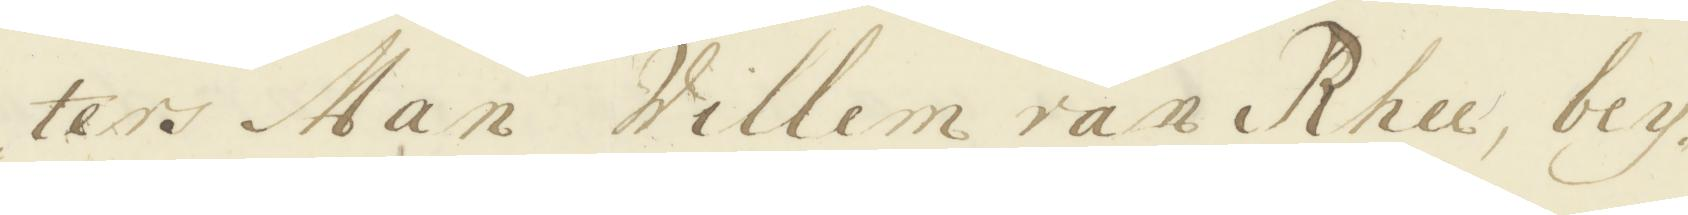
„ters Man Willem van Rhee, bey„
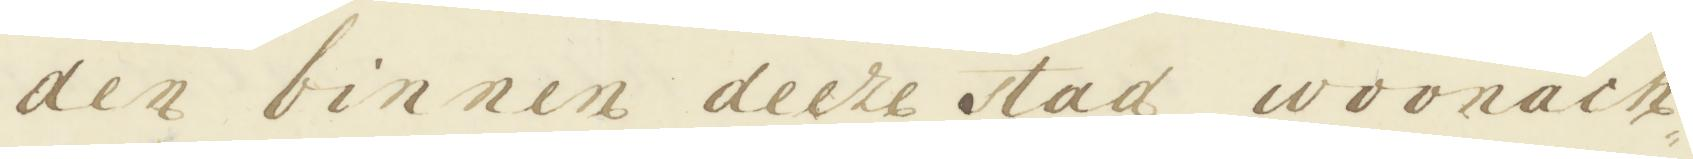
den binnen deeze stad woonach„
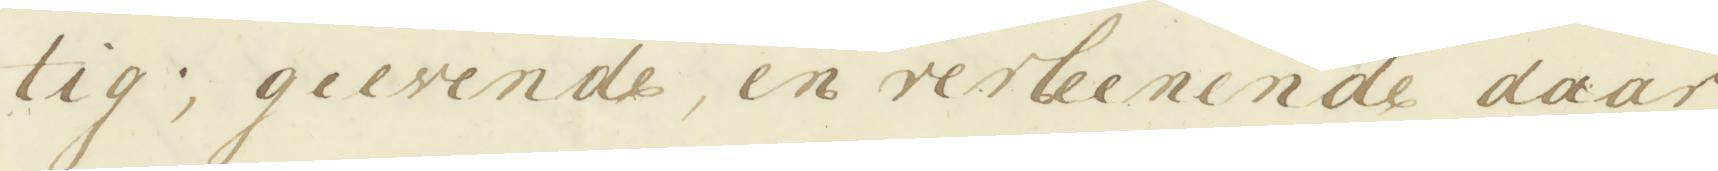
tig, geevende, en verleenende daar
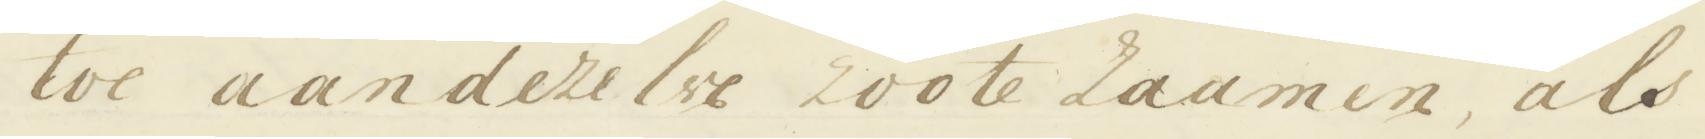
toe aan dezelve zoo te Zaamen, als
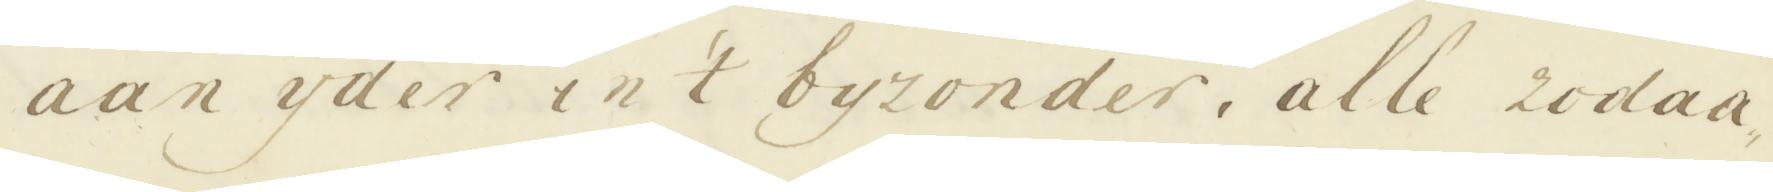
aan yder in ’t byzonder, alle zodaa„
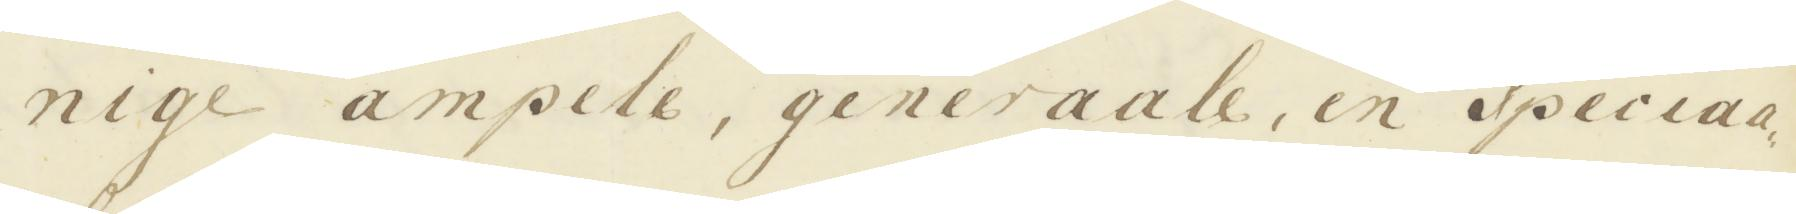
nige ampele, generaale, en speciaa„
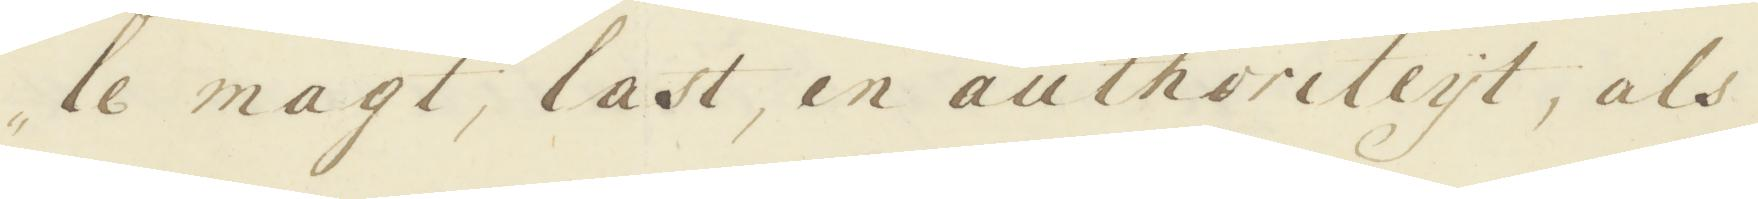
„le magt; last, en authoriteijt; als
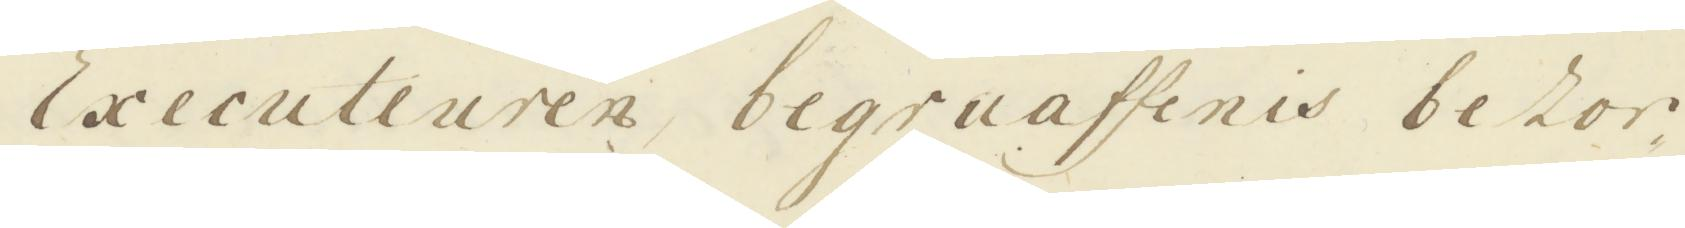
Executeuren, begraaffenis bezor„
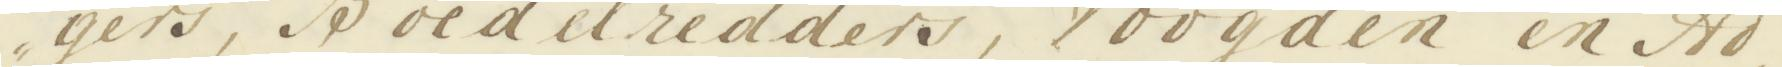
„gers, Boedelredders, Voogden en Ad
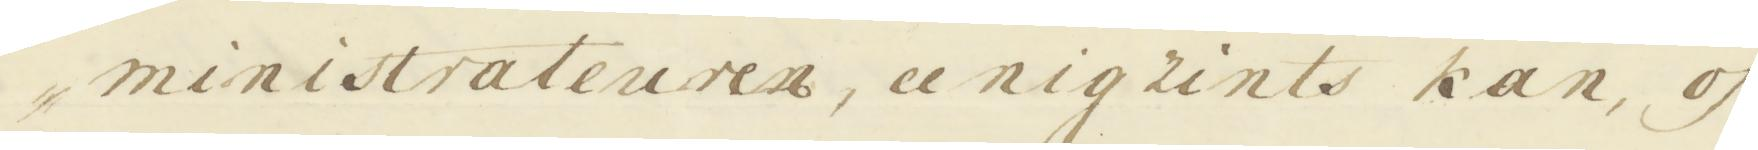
„ministrateuren, eenigzints kan, of
